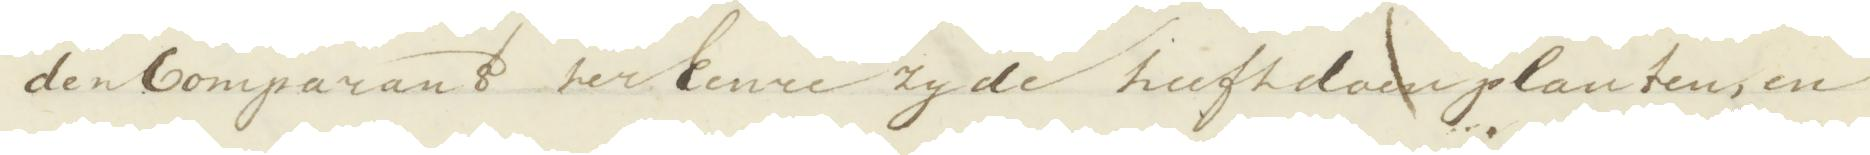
den Comparant ter Eenre zyde heeft doen planten, en
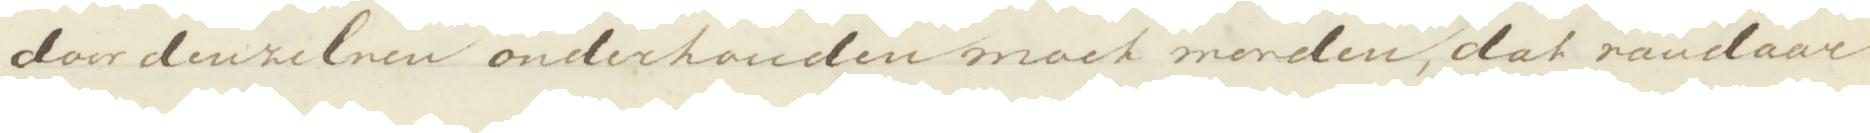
door denzelven onderhouden moet worden, dat vandaar
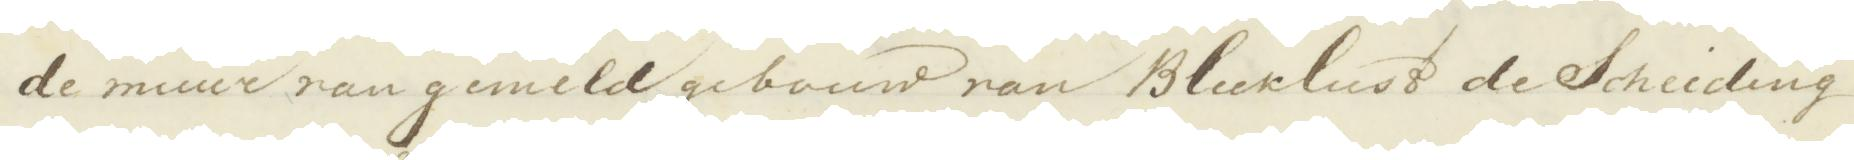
de muur van gemeld gebouw van Bleeklust de Scheiding
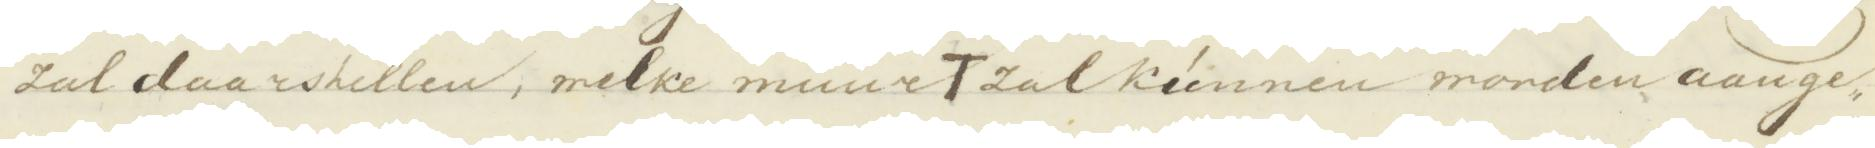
zal daarstellen, welke muur zal kunnen worden aange„
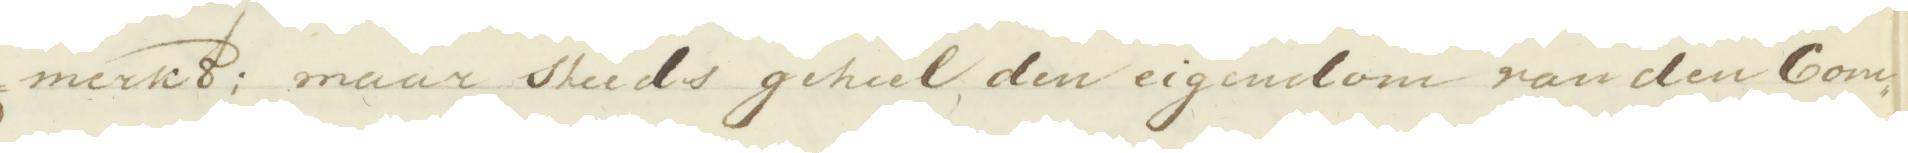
merkt; maar steeds geheel den eigendom van den Com„
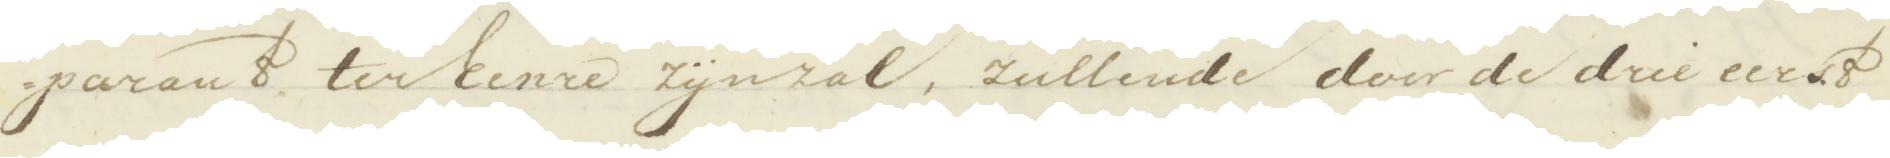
parant ter Eenre zijn zal, zullende door de drie eerst
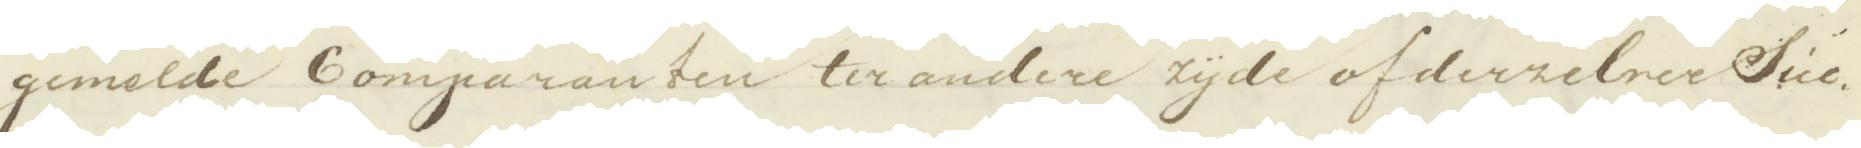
gemelde Comparanten ter andere zijde of derzelver Suc,
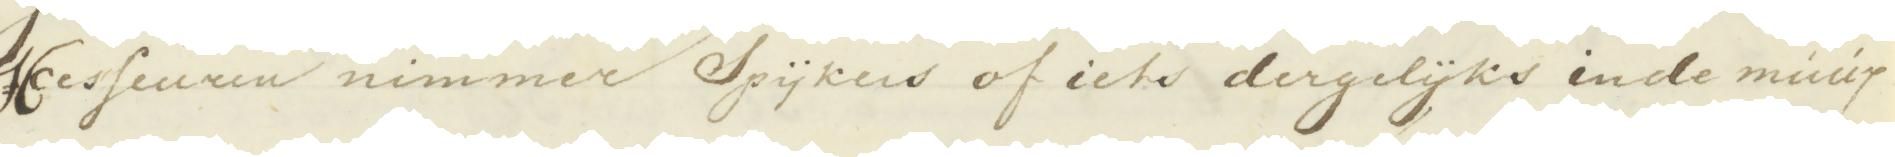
cesseuren nimmer Spijkers of iets dergelijks in de muur
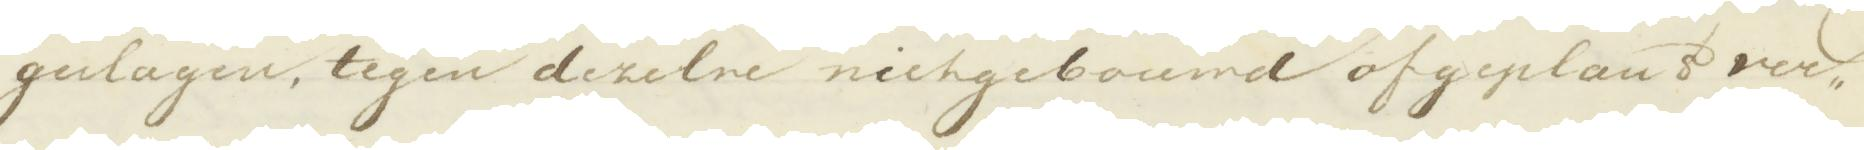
geslagen, tegen dezelve niet gebouwd of geplant ver„
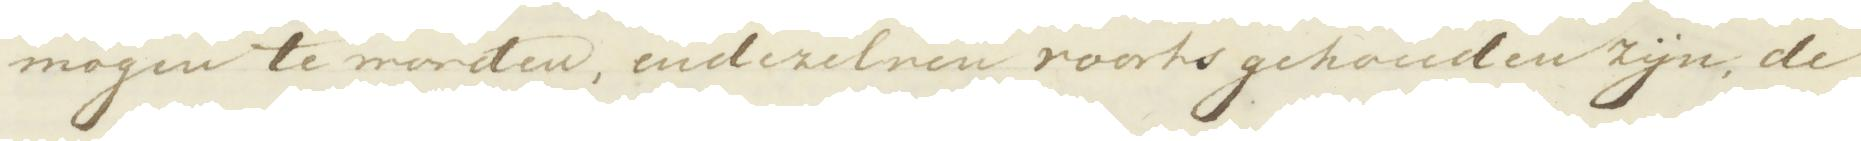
mogen te worden, en dezelven voorts gehouden zijn de
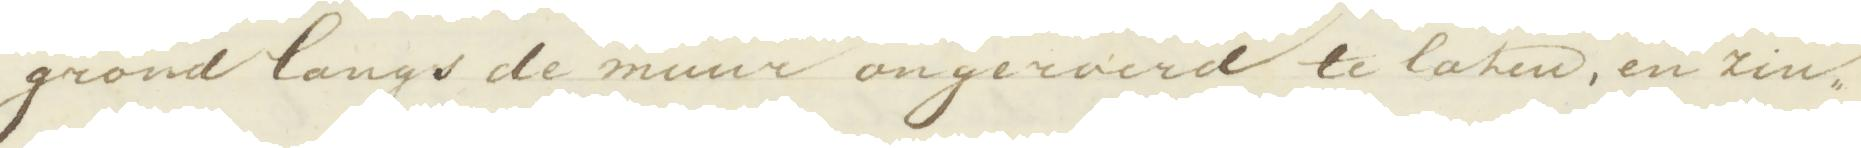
grond langs de muur ongeroerd te laten, en zin„
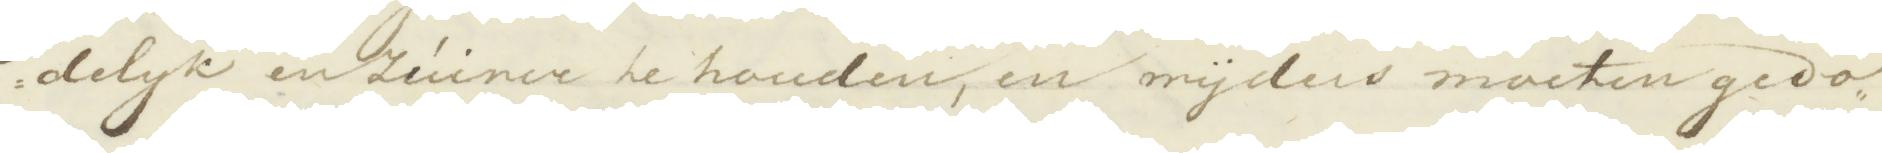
=delijk en zuiver te houden, en wijders moeten gedo„
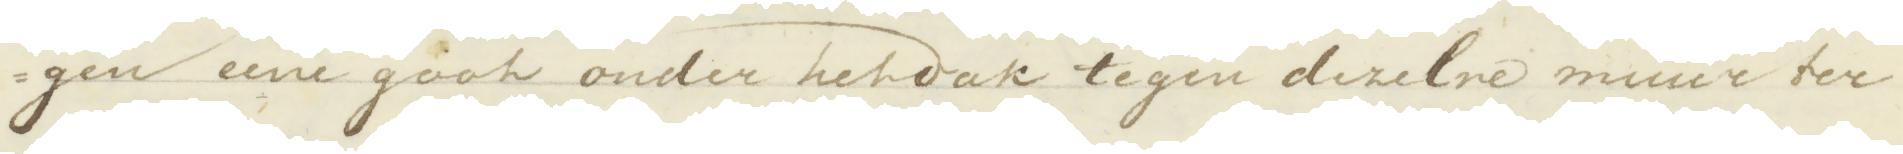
=gen eene goot onder het dak tegen dezelve muur ter
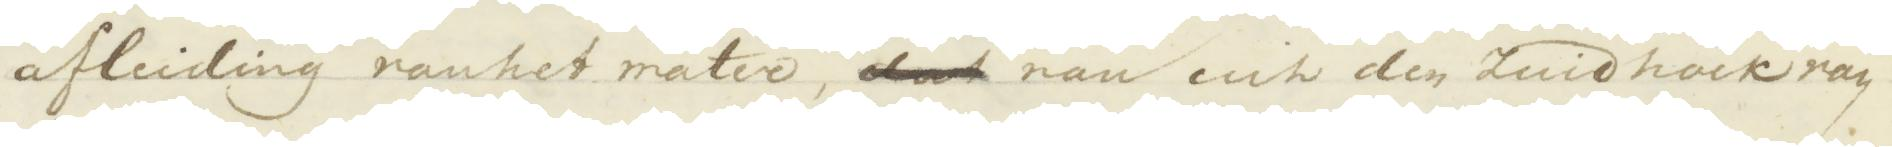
afleiding van het water, xdat van uit den zuidhoek van
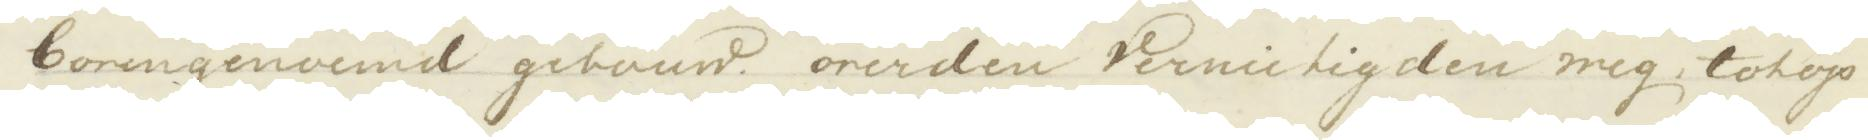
bovengenoemd gebouw. over den Vernietigden weg tot op
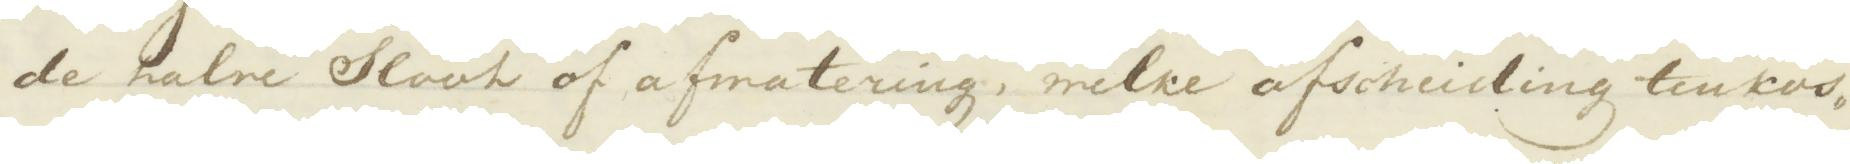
de halve Sloot of afwatering, welke afscheiding ten kos„
